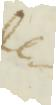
d:e
